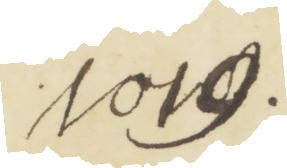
1019.
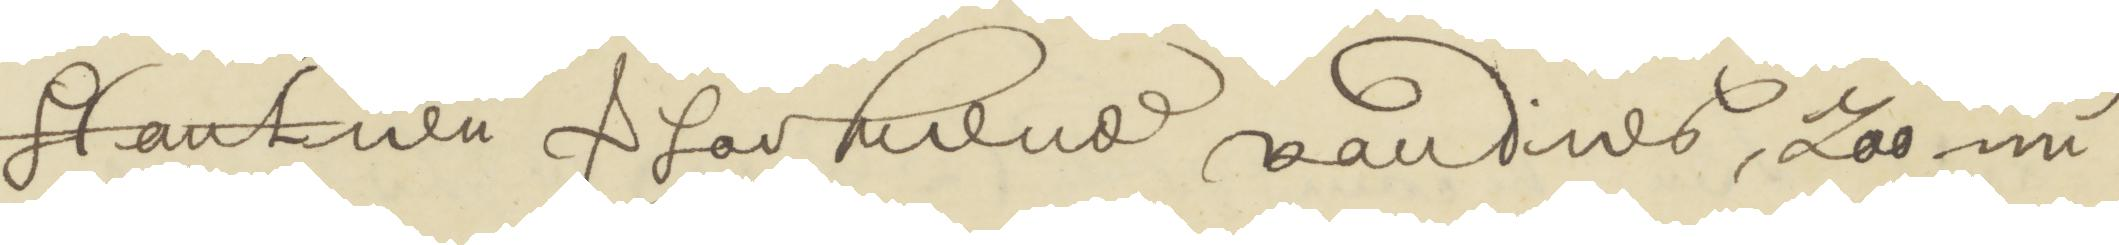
stantien versoekende van dies, zoo nu
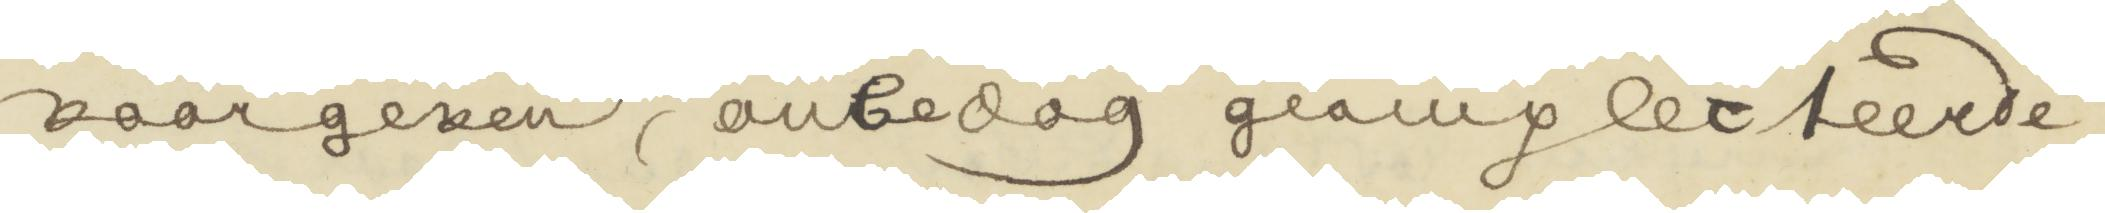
voorgeven, anbedag geamplecteerde
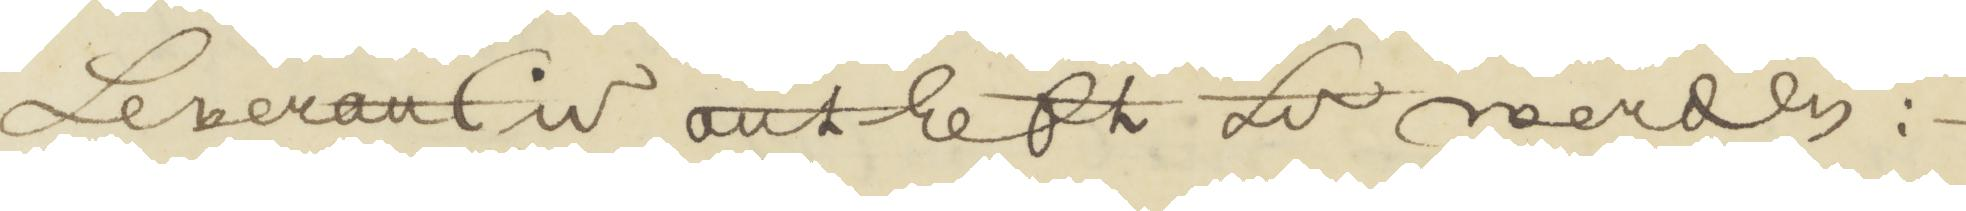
Leverantie ontheft te werden:
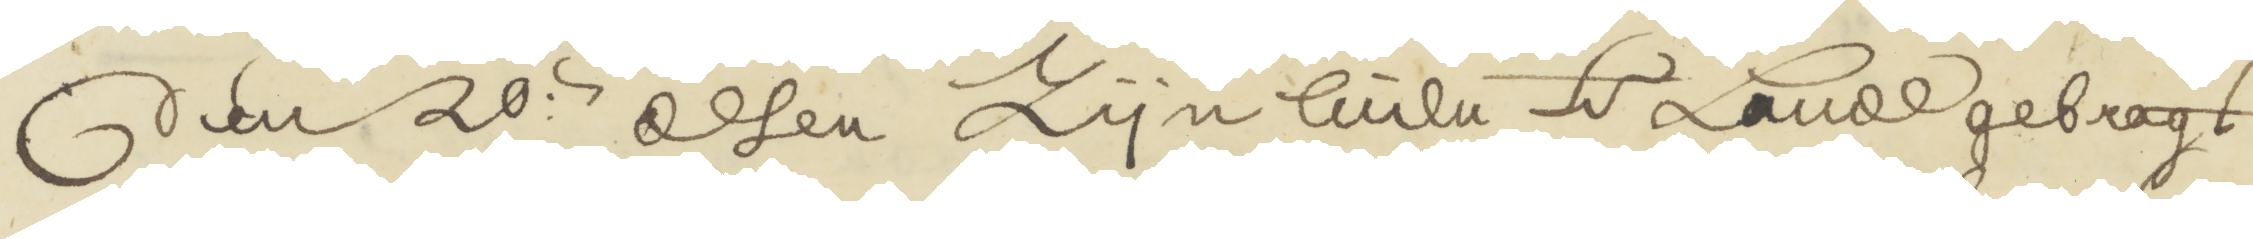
den 20:' deser zijn hier te Lande gebragt
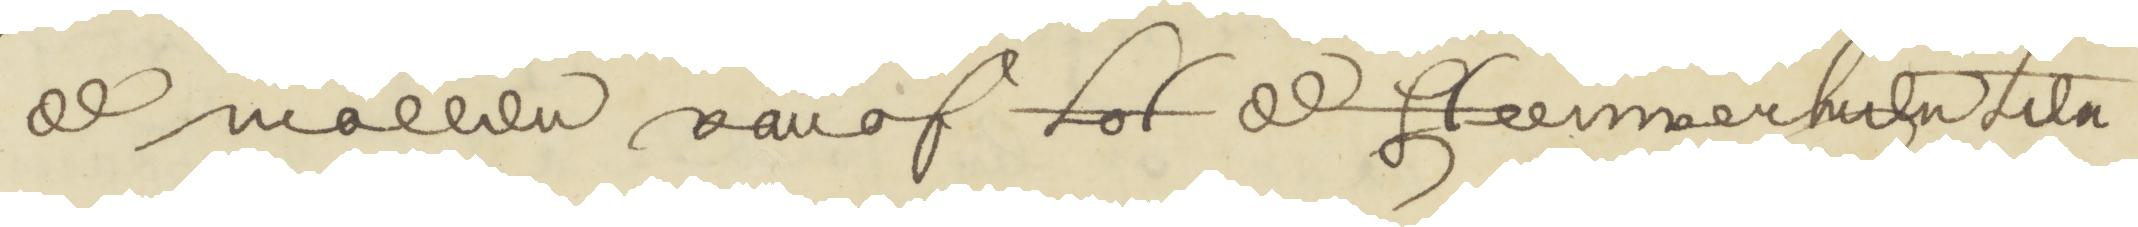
de mallen van of tot de steenwerken tila
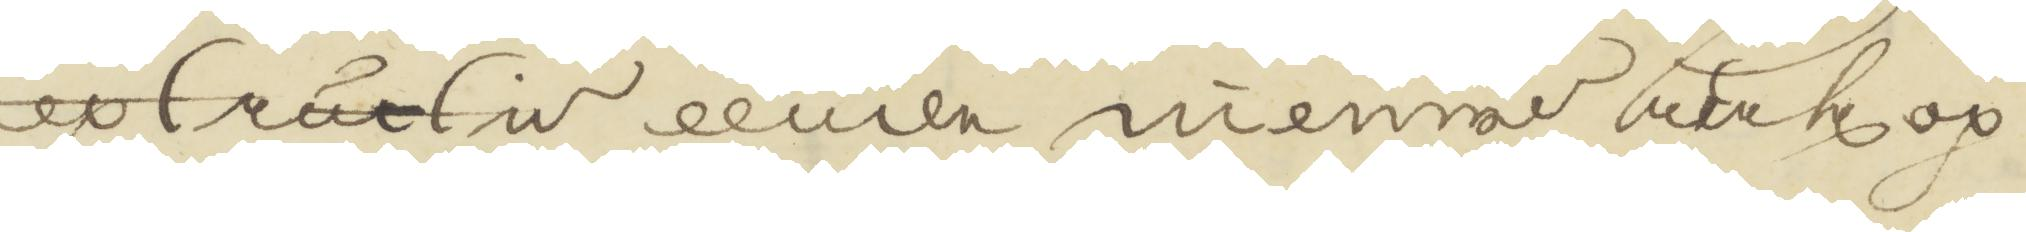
extractie eener nieuwe kerk op
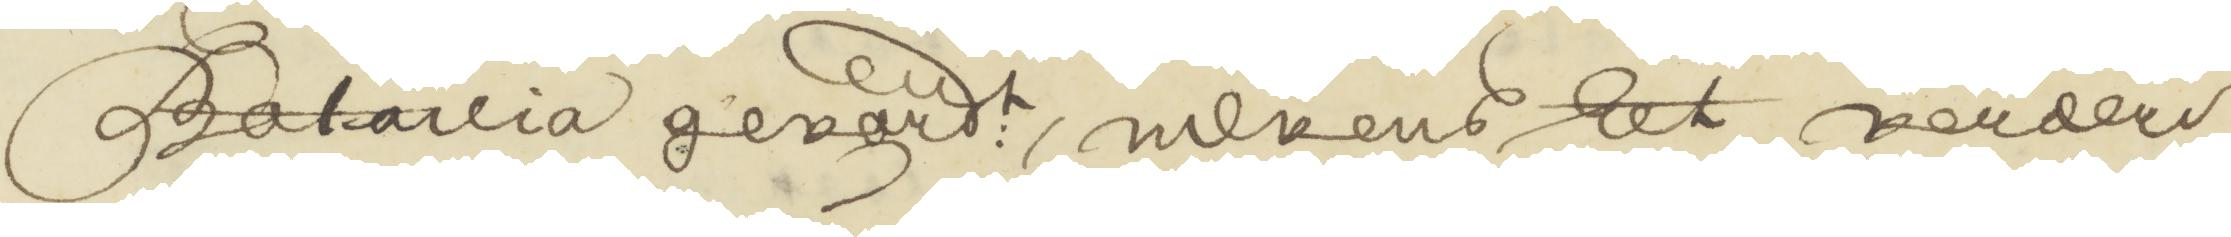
Batavia gevord:t, nevens het verdere
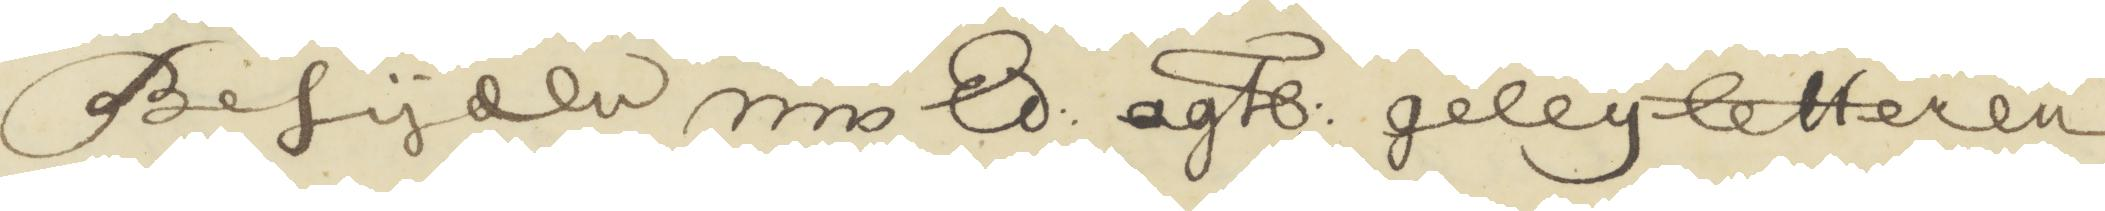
Besijden uw Ed: agtb: geleij letteren
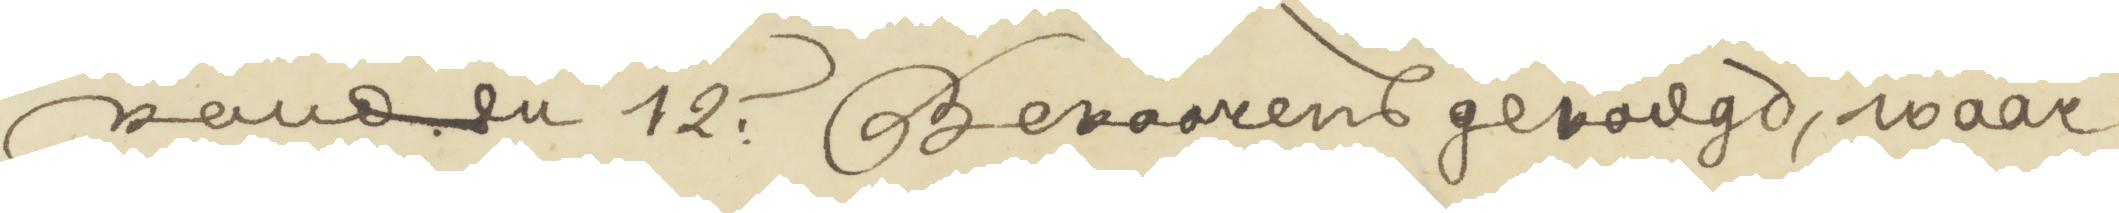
van den 12:' Bevoorens gevoegd, waar
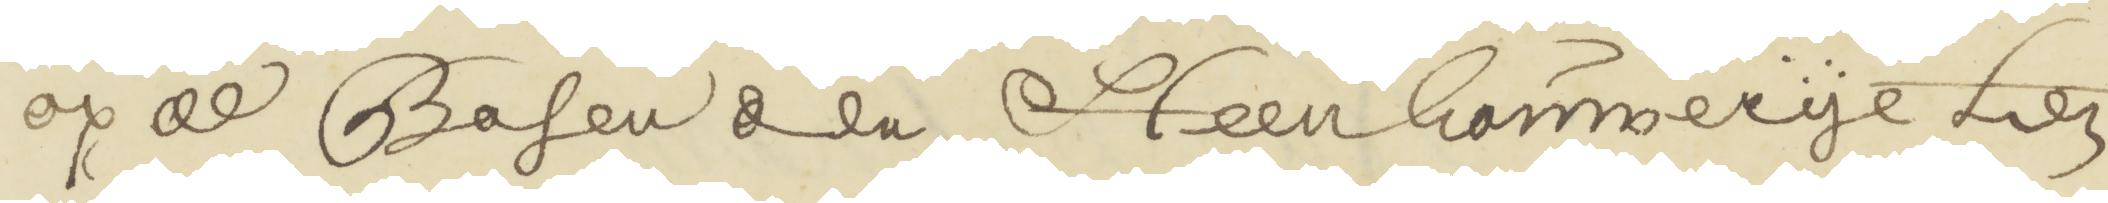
op de Basen der Steenhouwerije ten
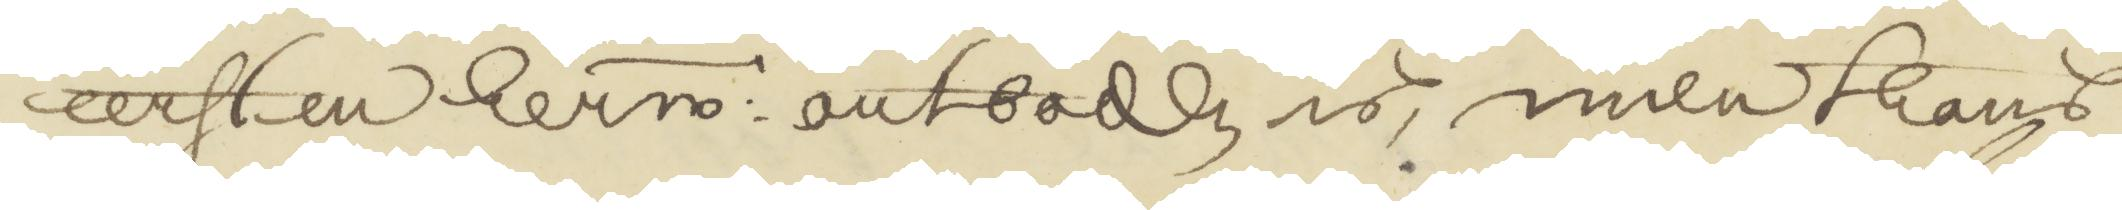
eersten herw: ontboden is, men thans
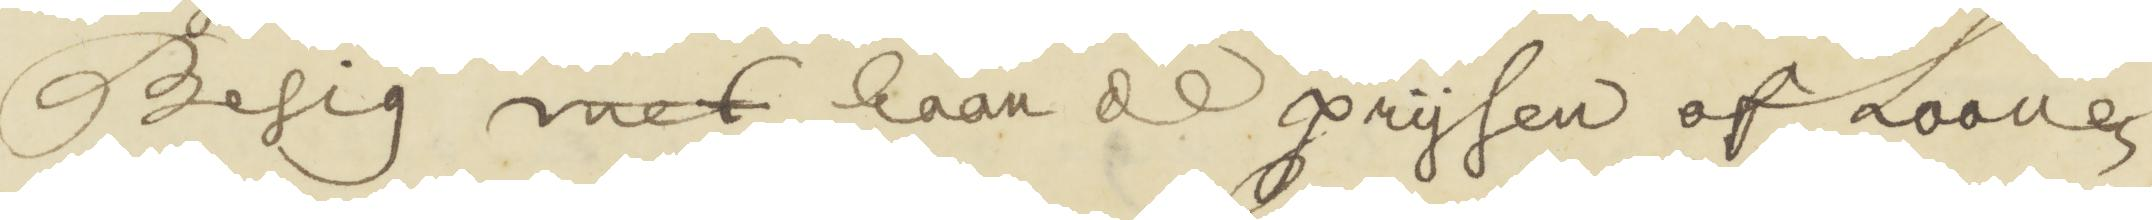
Besig met haar de prijsen of Loonen
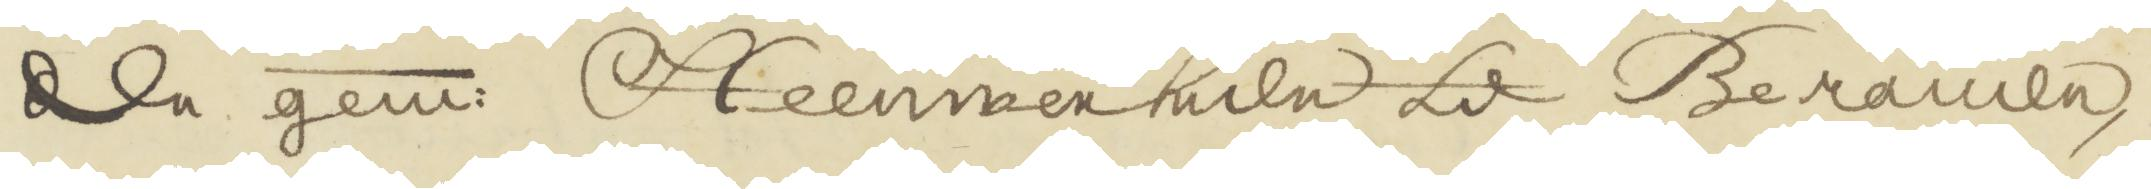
den gem: Steenwerken te Beramen,
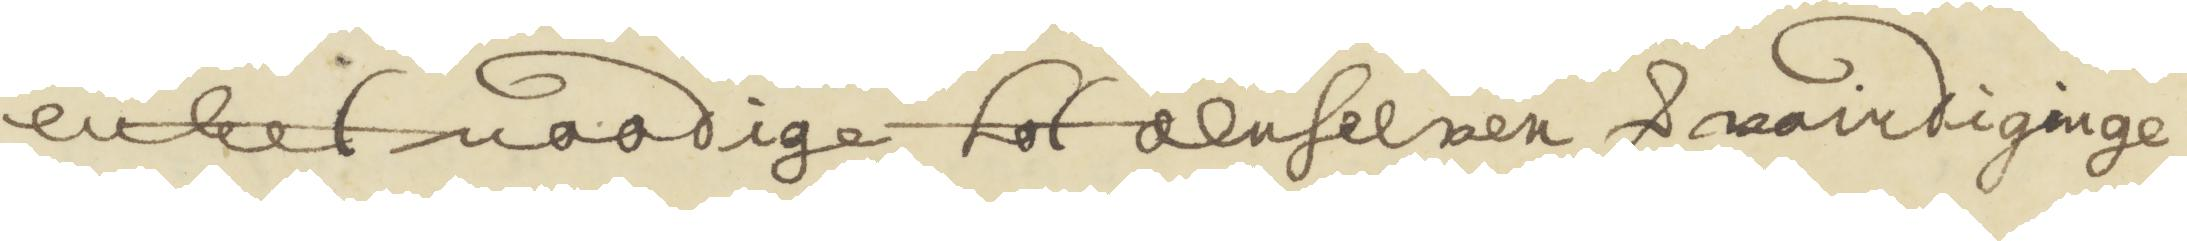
en het noodige tot denselven vervairdiginge
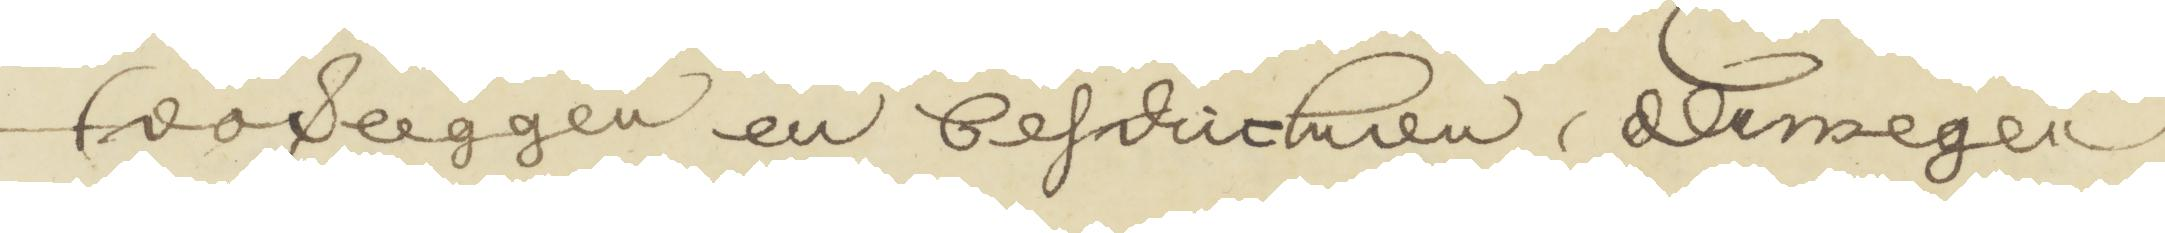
te overleggen en beschicken, derwegen
